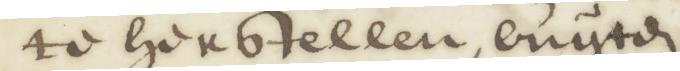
te herstellen, buijten
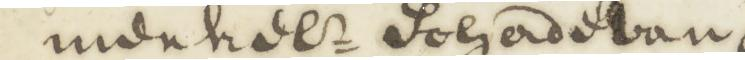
merkelijk schade van
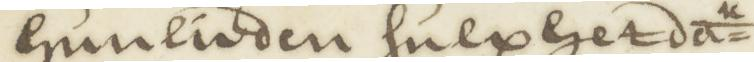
hunlieden sulx het da=r-
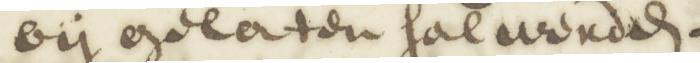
bij gelaten sal werden.
